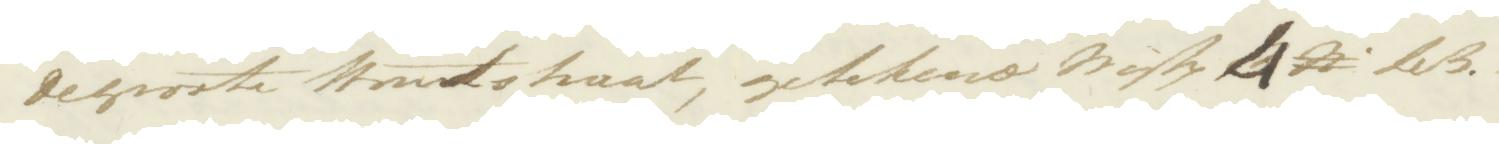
de groote Houtstraat, getekend wijk 4 n=o 43.
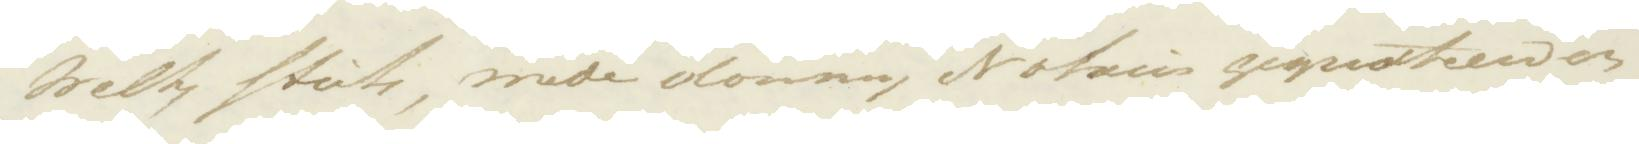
welk stuk, mede door my Notaris gequoteerd en
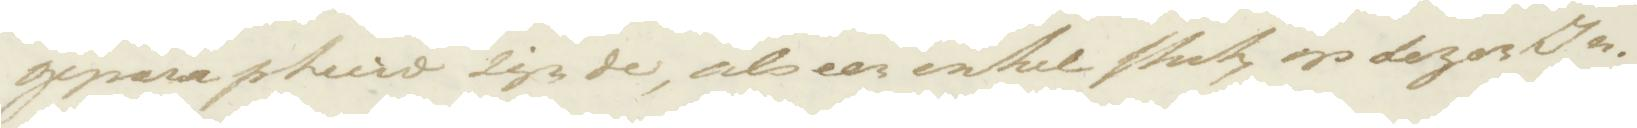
geparapheerd zijnde, als een enkel stuk op dezes In.
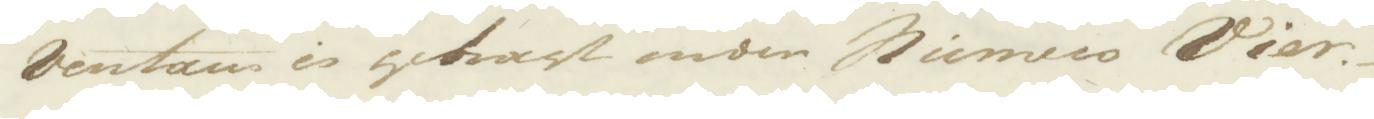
ventaris is gebragt onder Numero Vier.
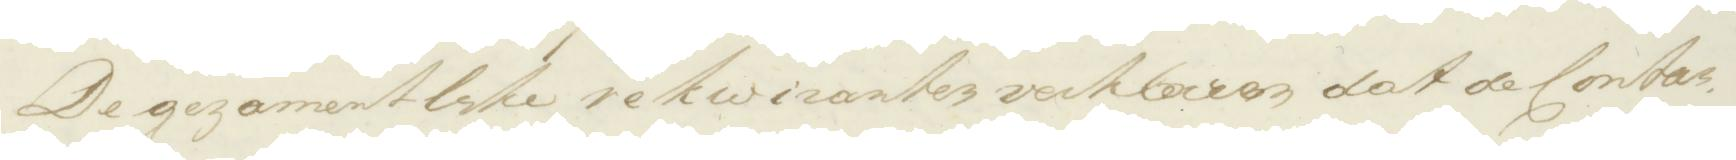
De gezamentlyke rekwiranten verklaren dat de Contan„
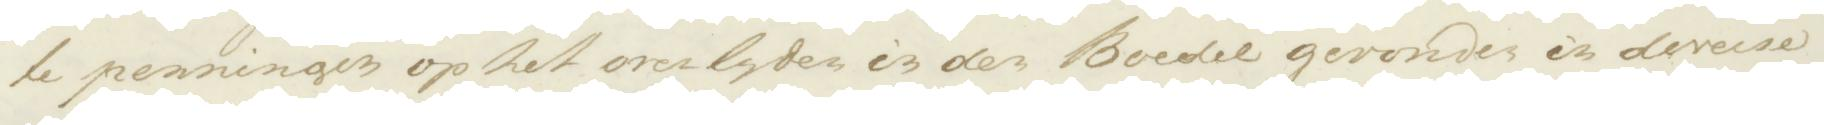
te penningen op het overlyden in den Boedel gevonden in diverse
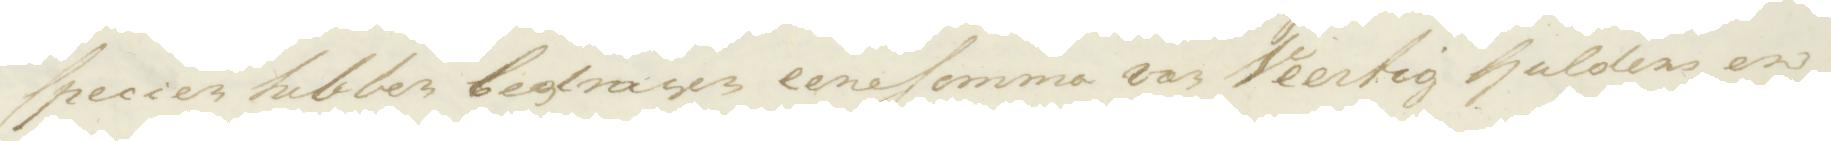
specien hebben bedragen eene somma van Veertig Guldens, en
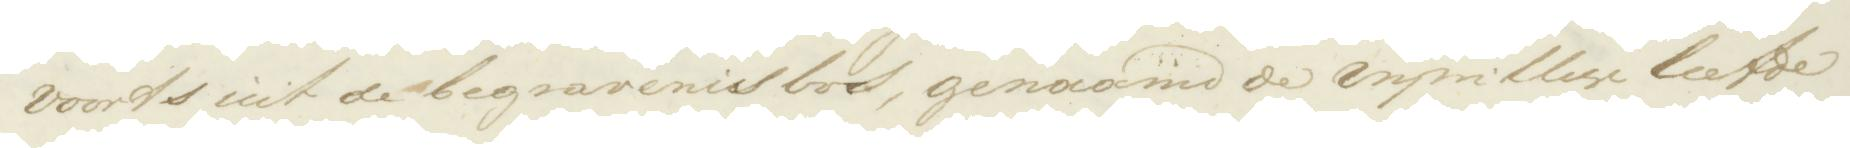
voorts uit de begravenis bos, genaamd de vrywillige liefde
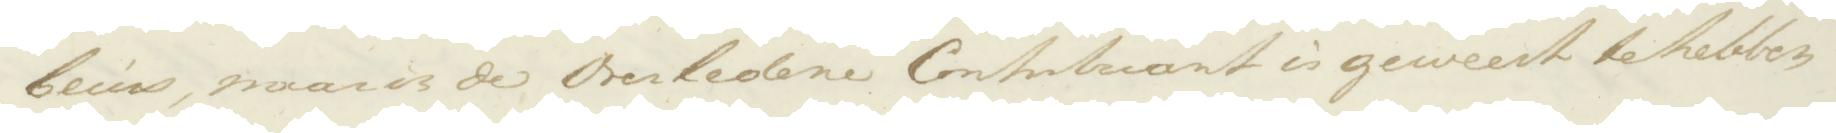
beurs, waar in de Overledene Contribuant is geweest te hebben
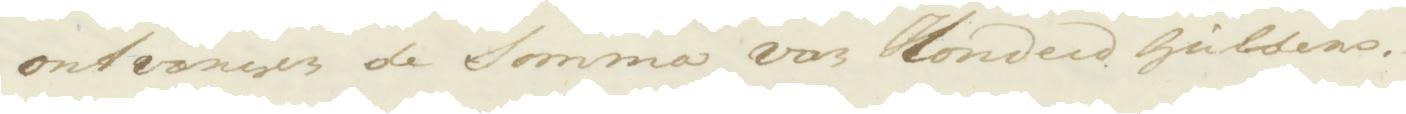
ontvangen de somma van Honderd Guldens.
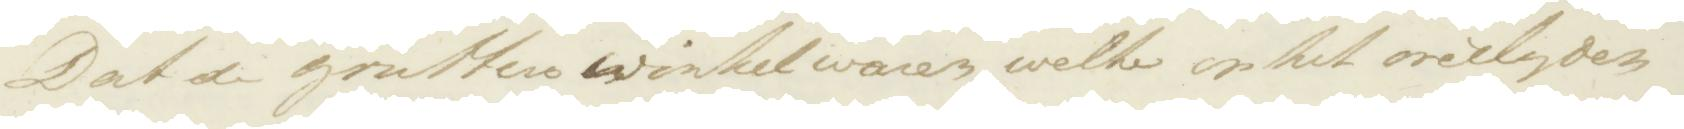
Dat de grutten winkel waren welke op het overlyden
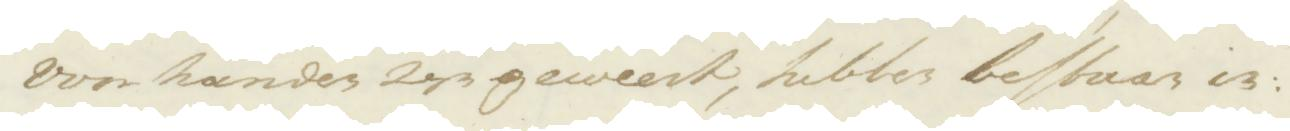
voor handen zyn geweest, hebben bestaan in:
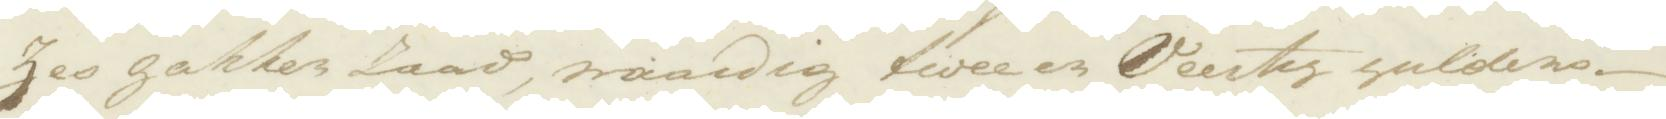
Zes zakken zaad, waardig twee en Veertig guldens.
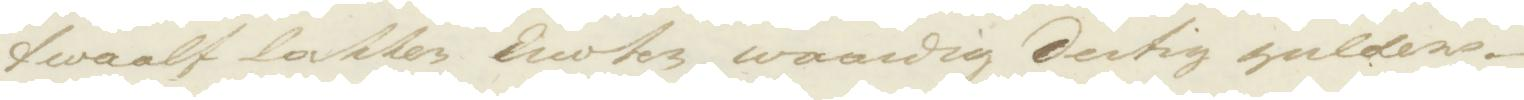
twaalf zakken Erwten, waardig dertig guldens.
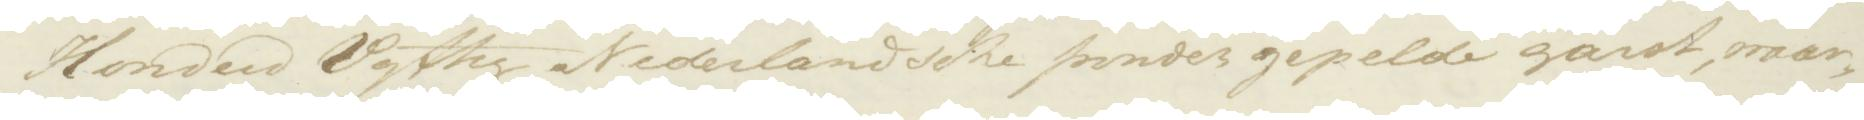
Honderd Vyftig Nederlandsche ponden gepelde garst, waar„
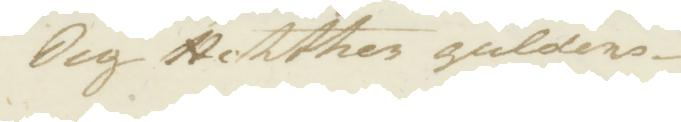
dig Achtien guldens.
